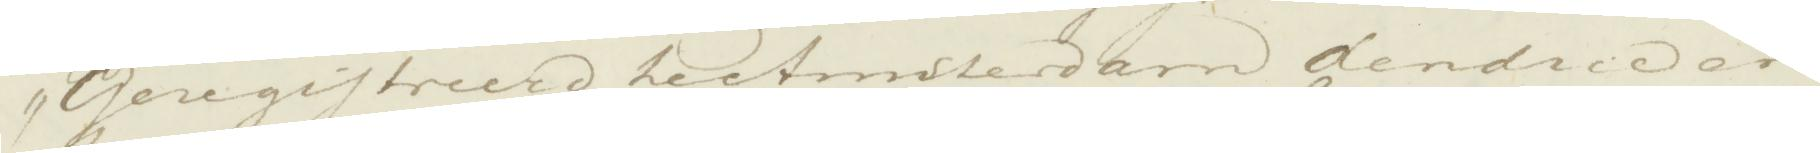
„Geregistreerd te Amsterdam den drie en
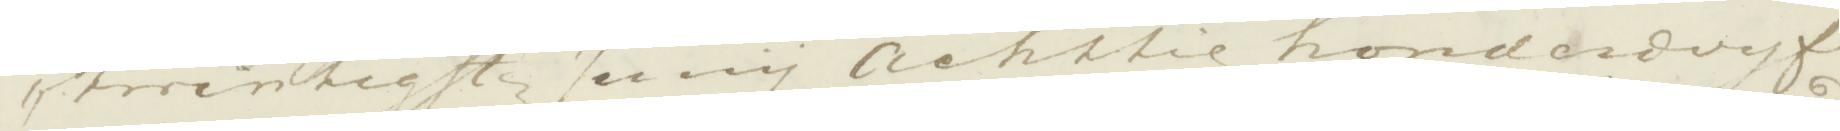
„twintigsten Junij Achttien honderdvyf
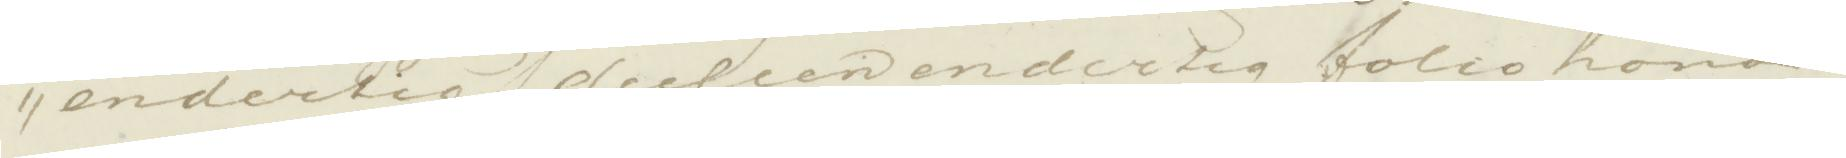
„en dertig deel een en dertig folio honderd
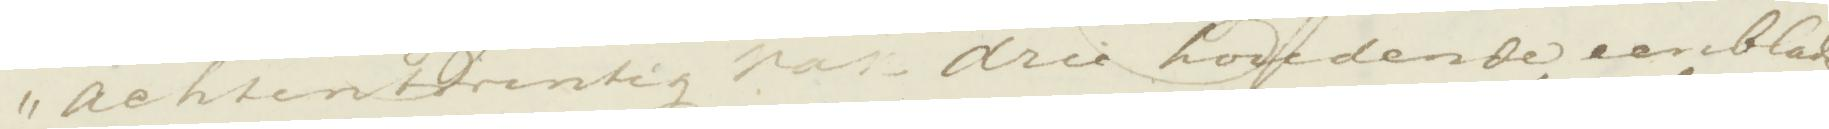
„achtentwintig vak drie houdende een blad
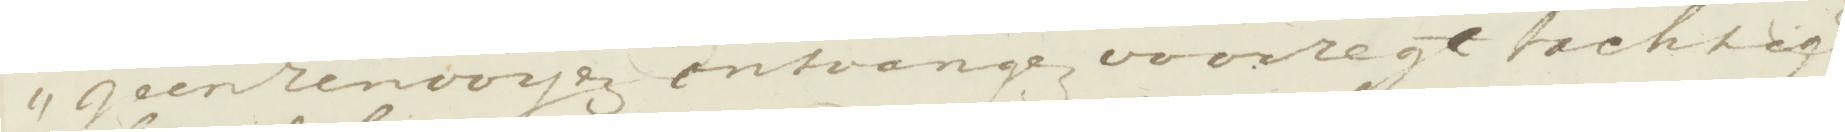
„geen renvoyen ontvangen voor regt tachtig
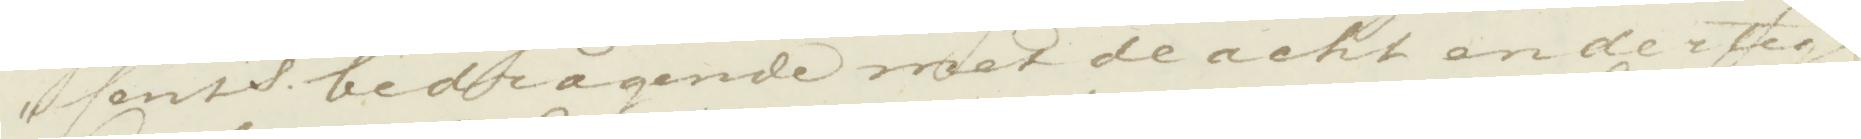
„Cents bedragende met de acht en dertig
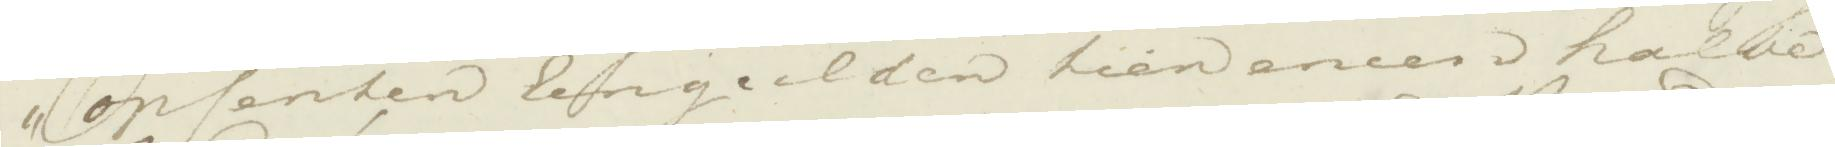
„opcenten Een gulden tien en een halve
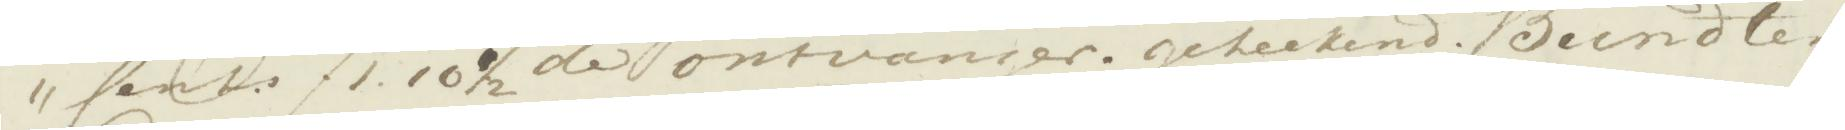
„Cents ƒ1.10½ de ontvanger, geteekend. Bundten
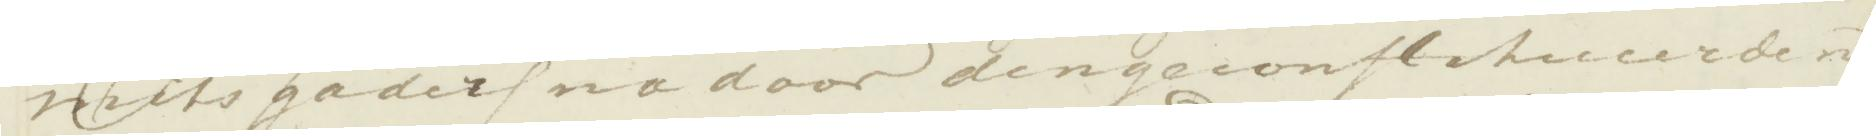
mits gaders na door den geconstitueerden
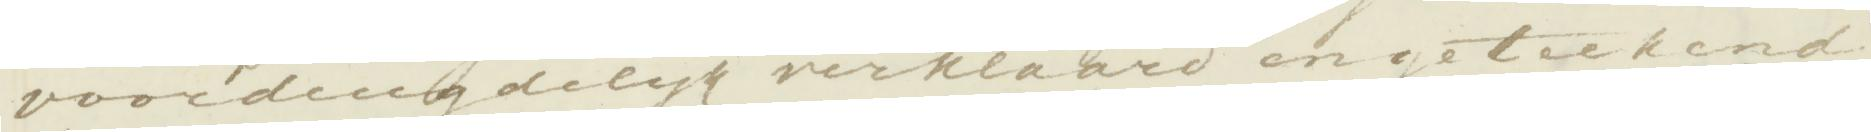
voor deugdelyk verklaard en geteekend
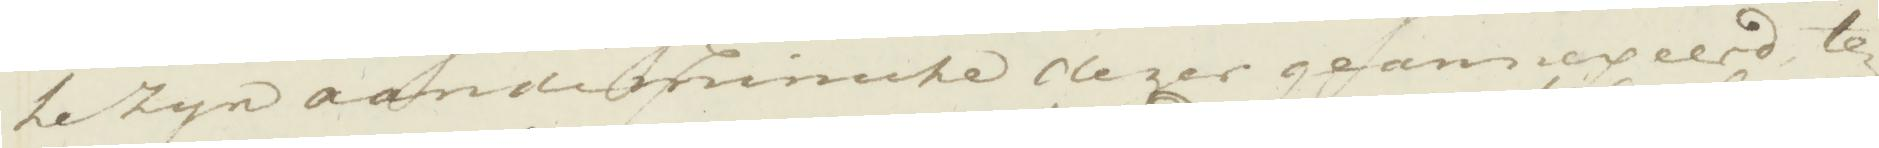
te zyn aan de minute dezer geannexeerd ten
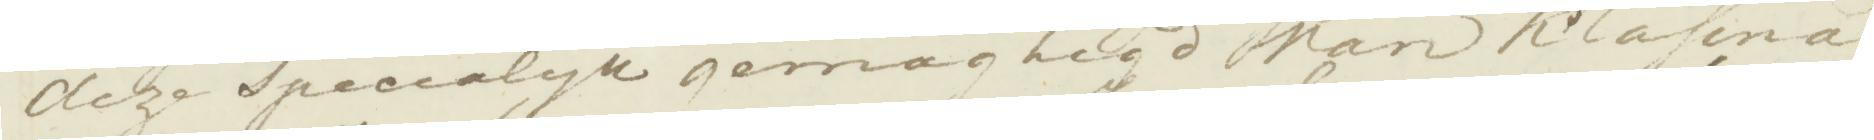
deze specialyk gemagtigd van Klasina
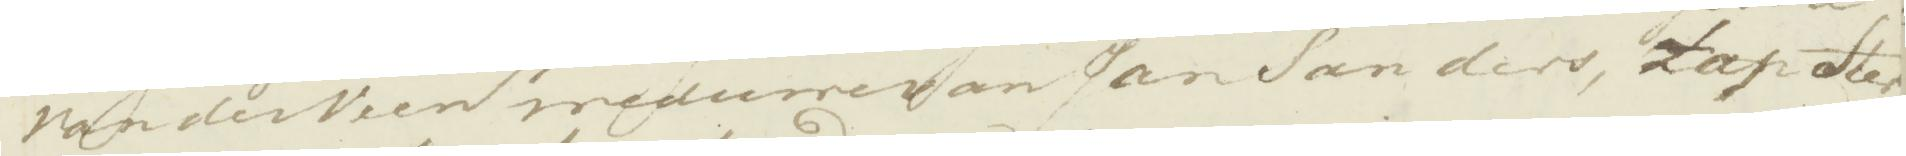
van der Veen weduwe van Jan Sanders, tapster
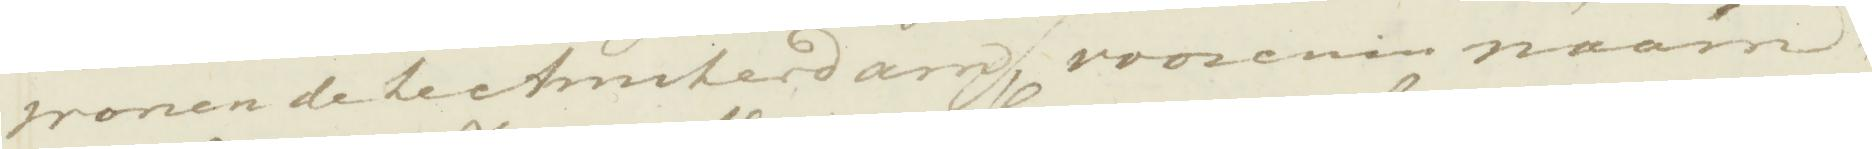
wonende te Amsterdam, voor en in naam
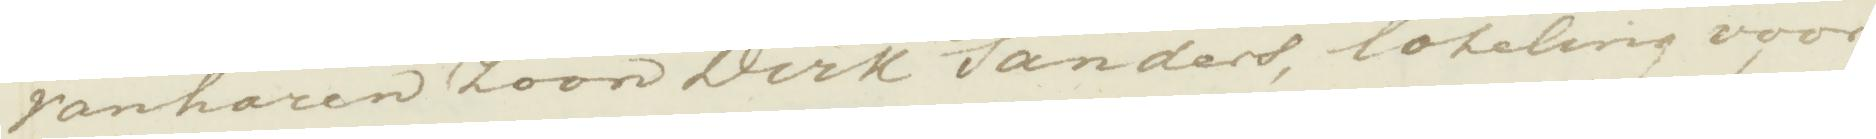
van haren zoon Dirk Sanders, loteling voor
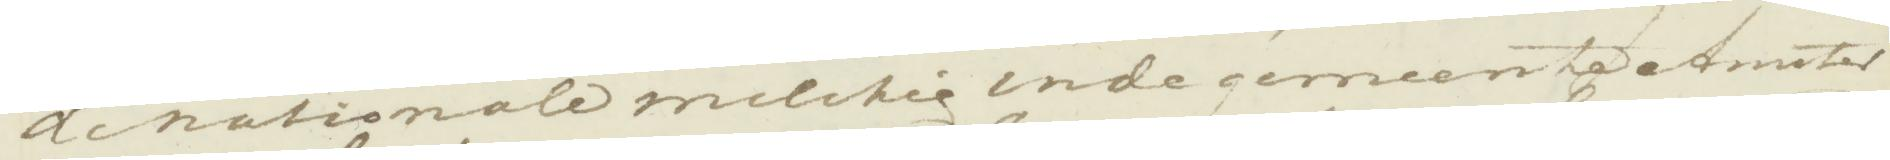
de nationale militie in de gemeente Amster
